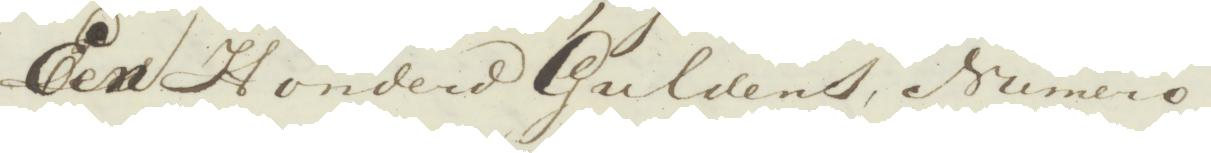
Een Honderd Guldens, Numero
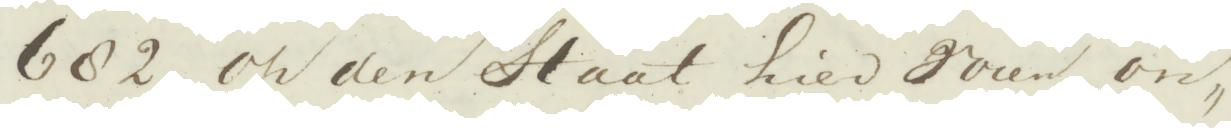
682 op den Staat hier voren, on„
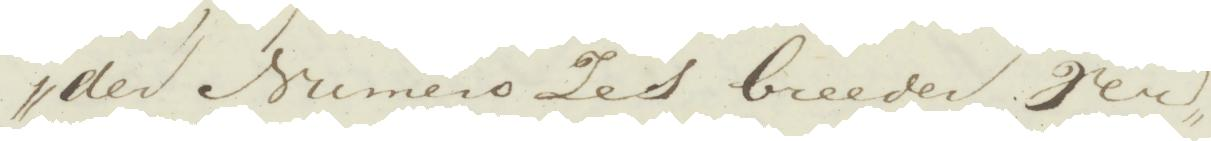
„der Numero Zes breeder Ver„
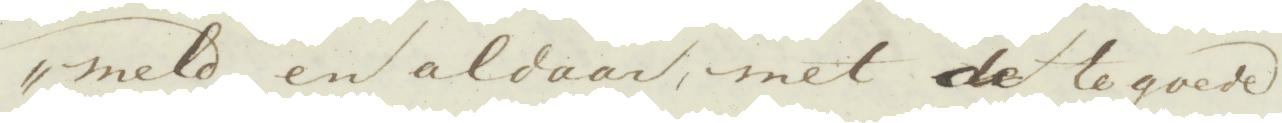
„meld, en aldaar, met de te goede
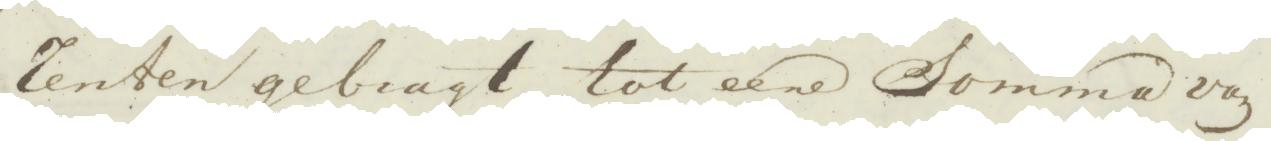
renten gebragt tot eene Somma van
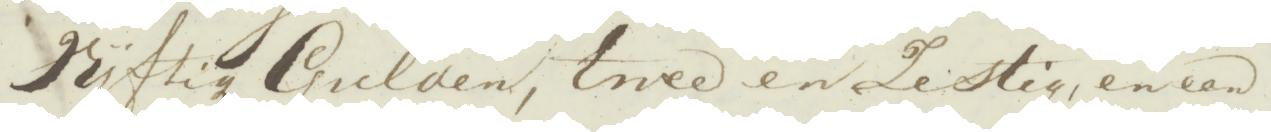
Vijftig Gulden, twee en Zestig, en een
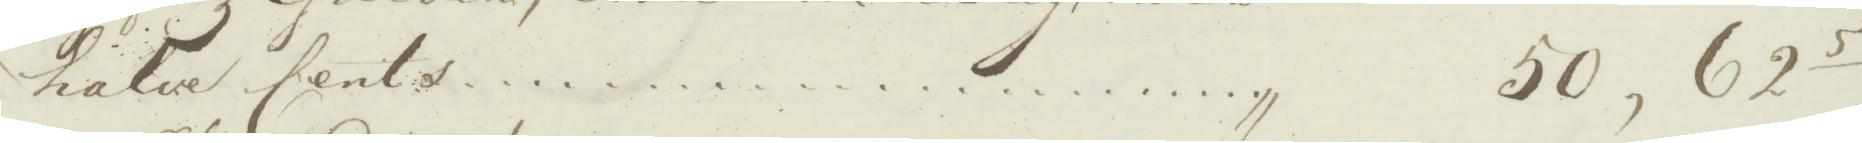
halve Cents . . . . . . . . . . . . . . . . . . . . . . . „50 , 62 /5
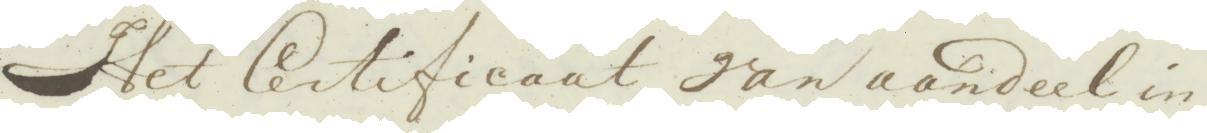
Het Certificaat van aandeel in
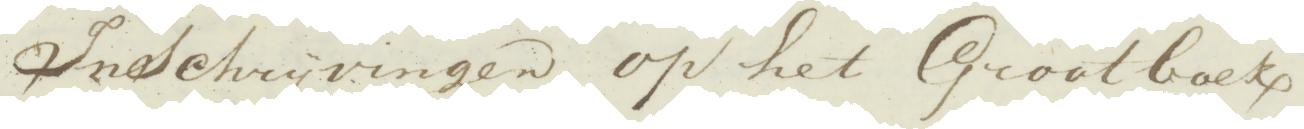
Inschrijvingen op het Grootboek
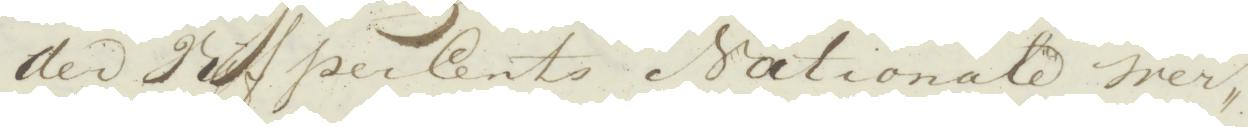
der Vijf per Cents Nationale wer„
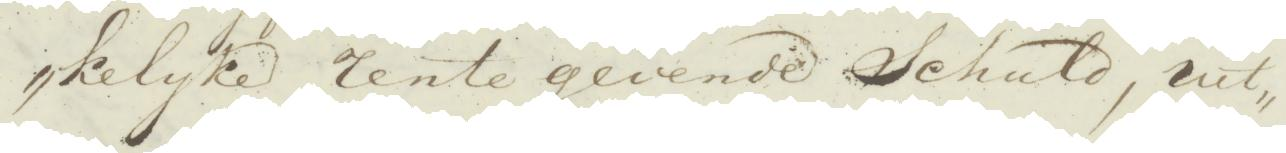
„kelyke rente gevende Schuld, uit„
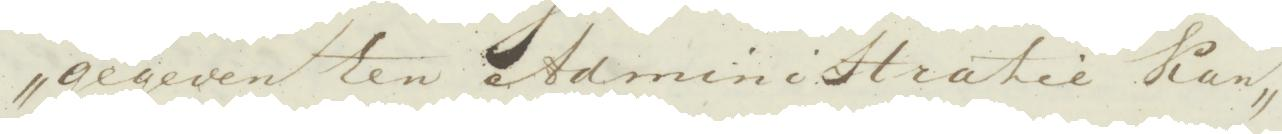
„gegeven ten Administratie Kan„
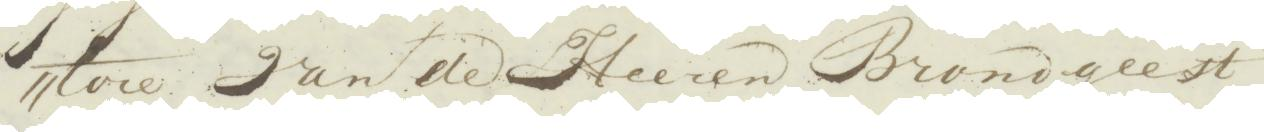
„tore van de Heeren Brondgeest
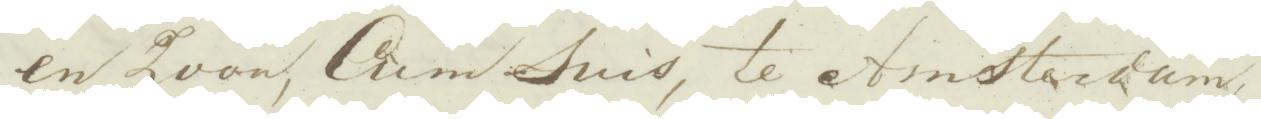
en Zoon, Cum Suis, te Amsterdam,
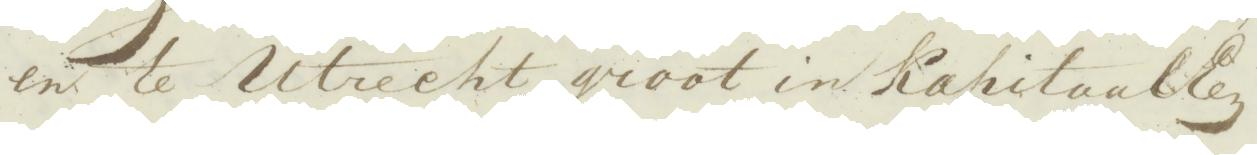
en te Utrecht, groot in Kapitaal Een
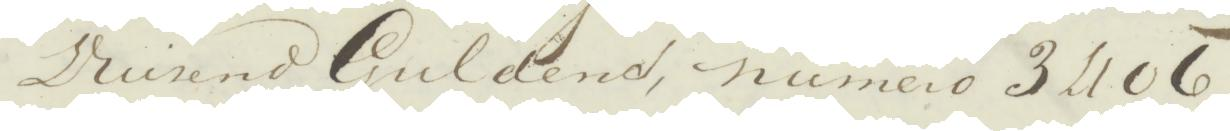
Duizend Guldens, numero 3406
